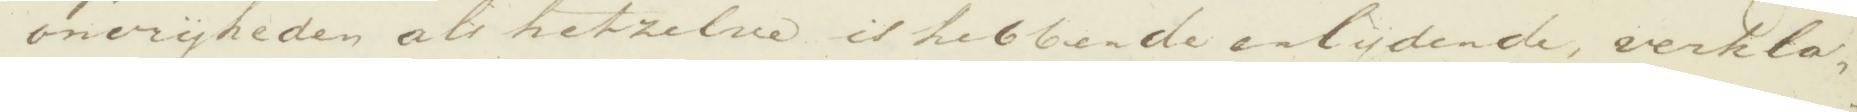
onvrijheden als hetzelve is hebbende en lijdende, verkla„
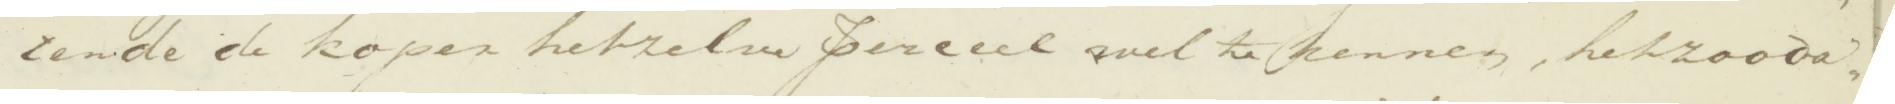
rende de koper hetzelve perceel wel te kennen, het zooda
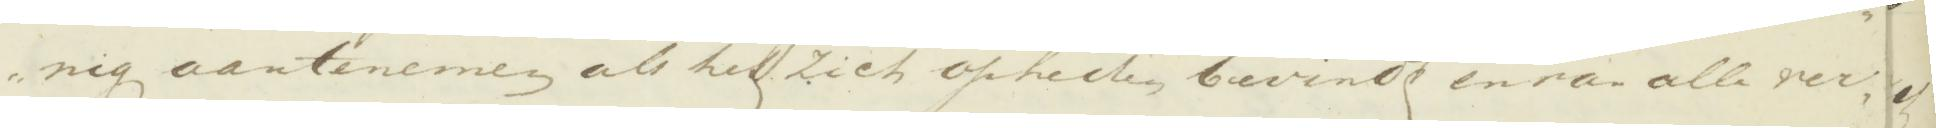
„nig aantenemen als het zich opheden bevindt en van alle ver„
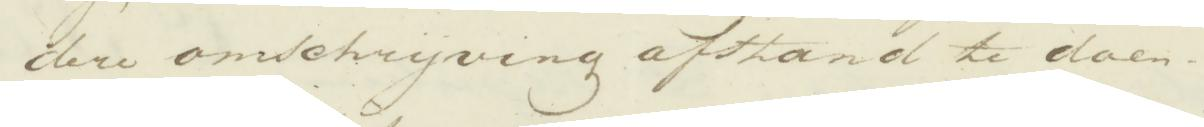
dere omschrijving afstand te doen.
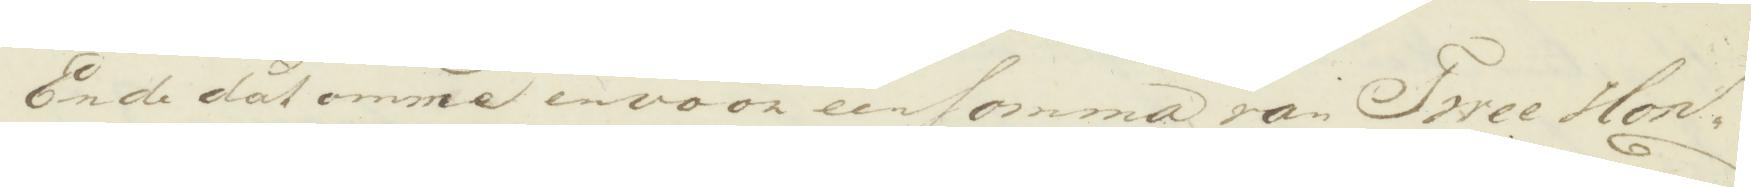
Ende dat omme en voor een Somma van Twee Hon„
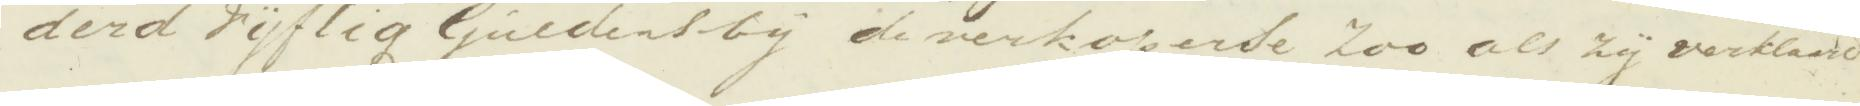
derd Vijftig Guldens bij de verkoperse zoo als zij verklaard
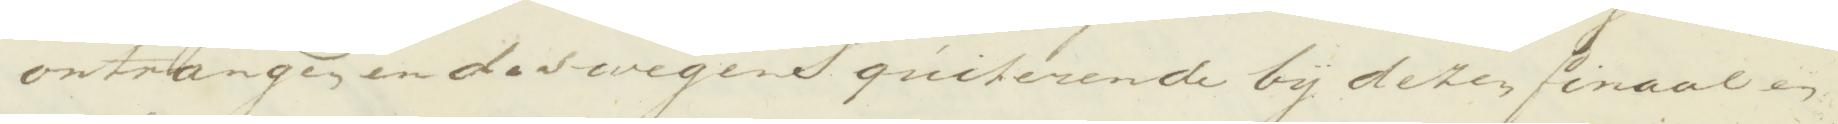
ontvangen en des wegens quiterende bij dezen finaal en
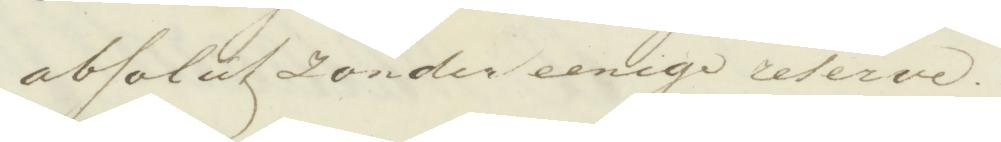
absolut zonder eenige reserve.
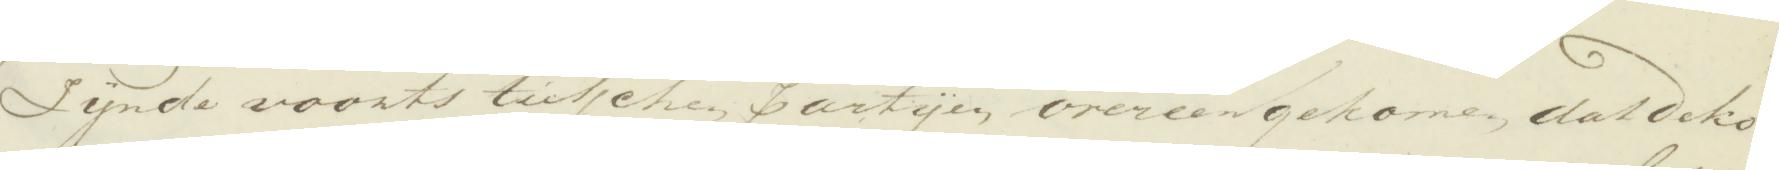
Zijnde voorts tusschen partijen overeengekomen dat de ko
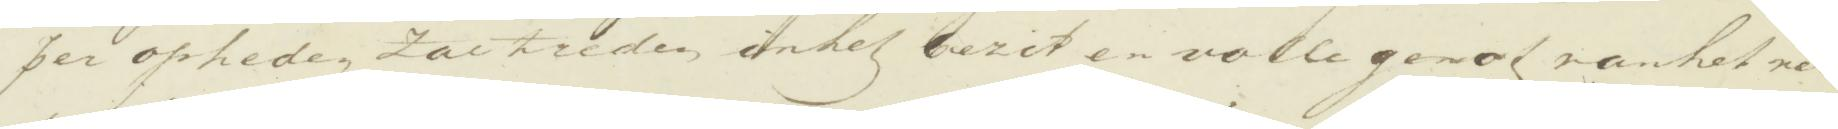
per opheden zal treden in het bezit en volle genot van het ver
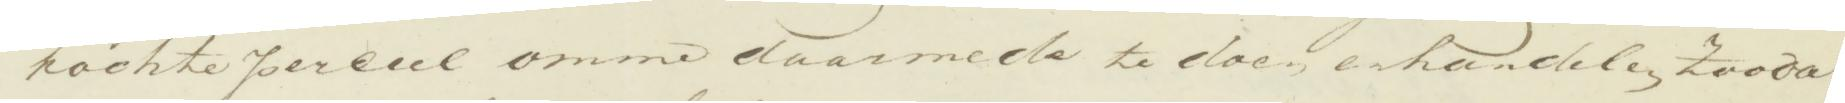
kochte perceel omme daarmede te doen en handelen zooda
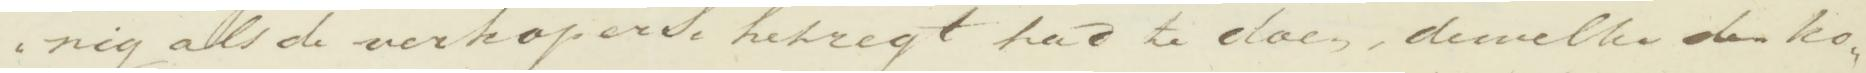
„nig als de verkoperse het regt had te doen, dewelke den ko„
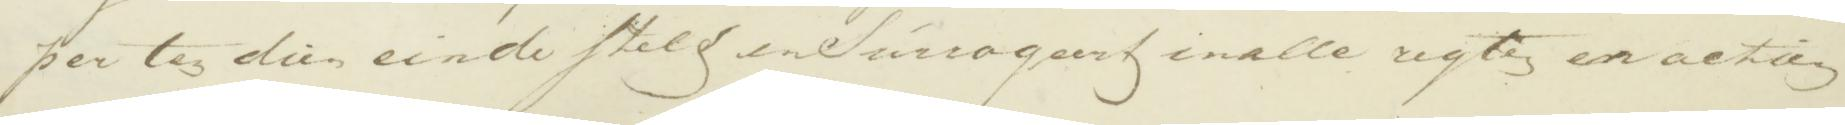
per ten dien einde stelt en Surrogeert in alle regten en actien
